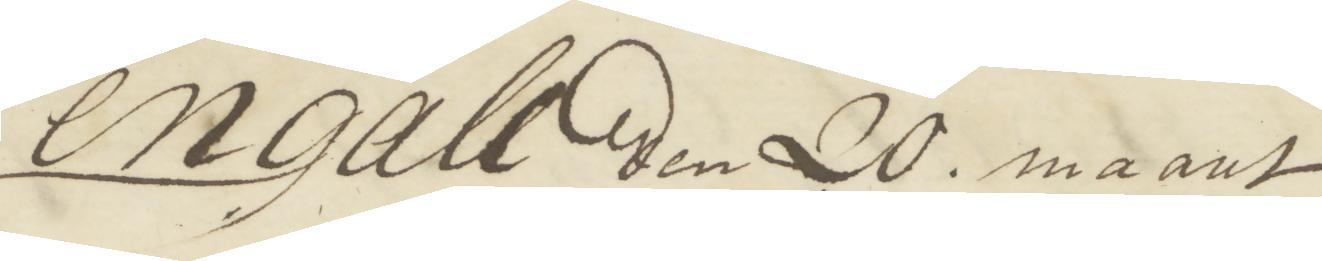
Van bengale den 20. maart 1737.
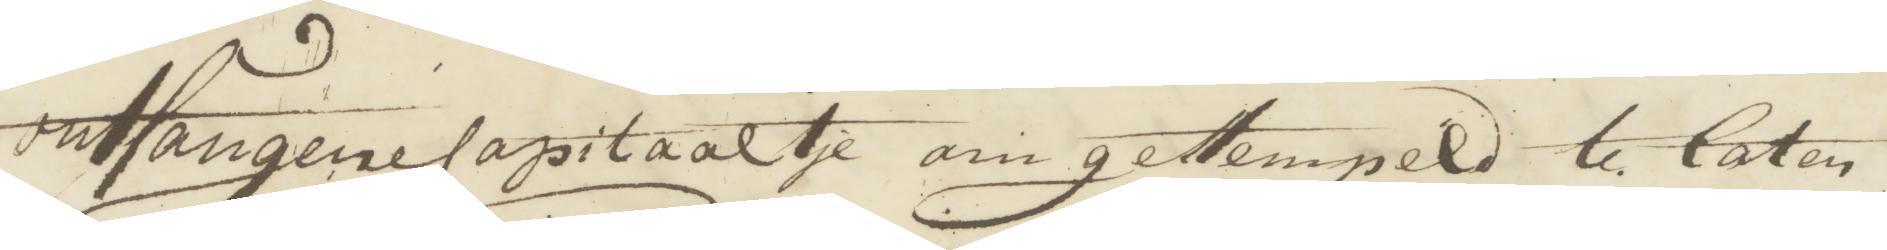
ontfangene Capitaaltje om gestempeld te laten
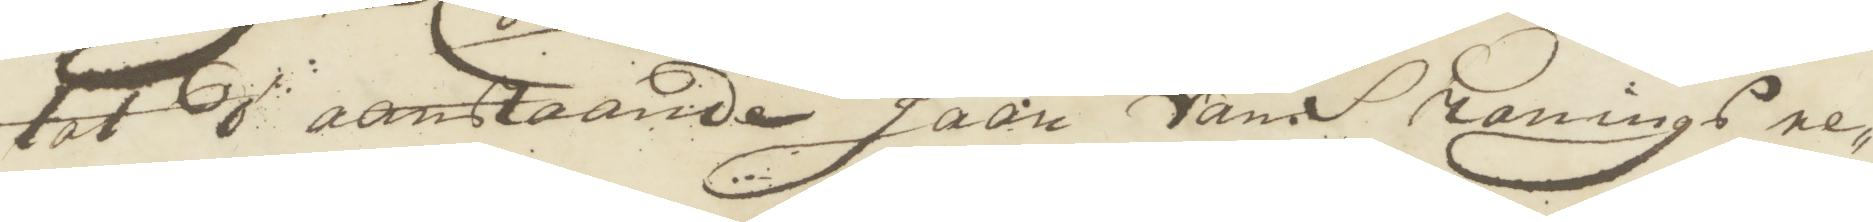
tot d' aanstaande jaar van s konings re„
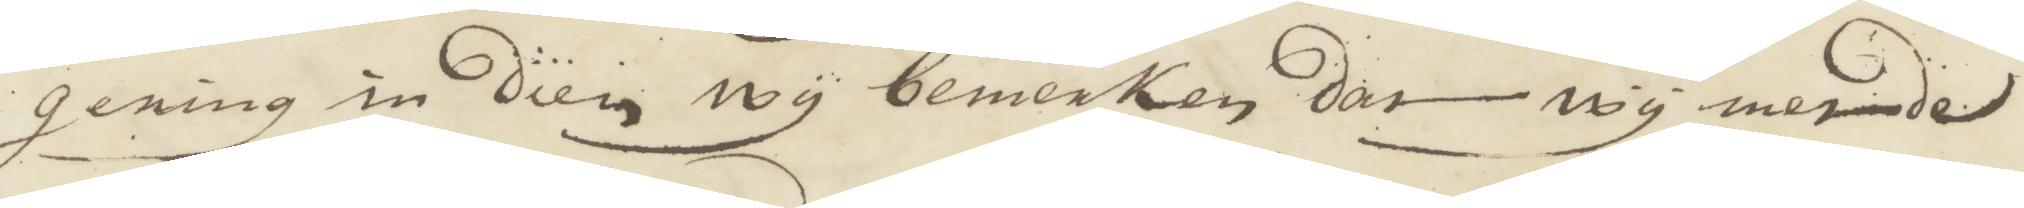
gering in dien wij bemerken dat wij met de
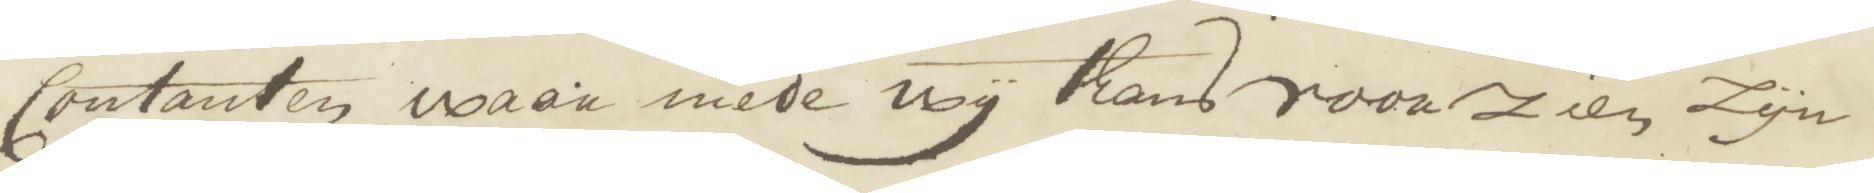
Contanten waar mede wij thans voor zien zijn
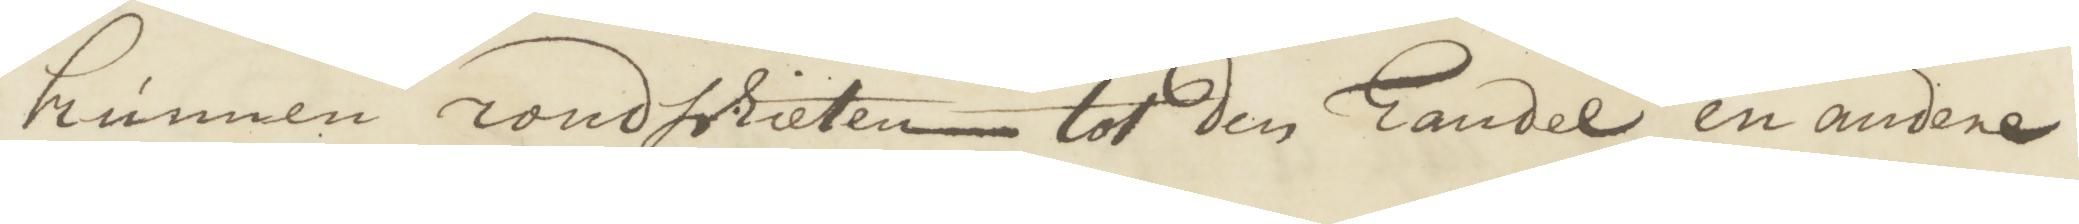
kunnen rondschieten tot den handel en andere
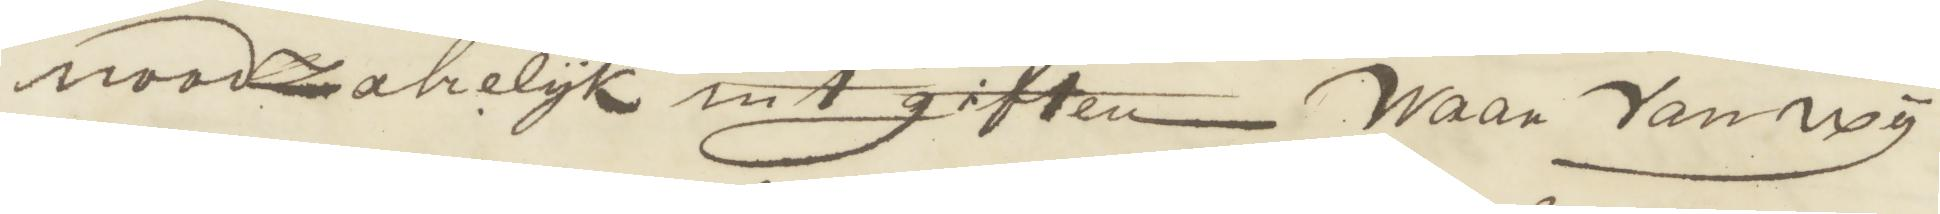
noodzakelijk in't giften waar van wij
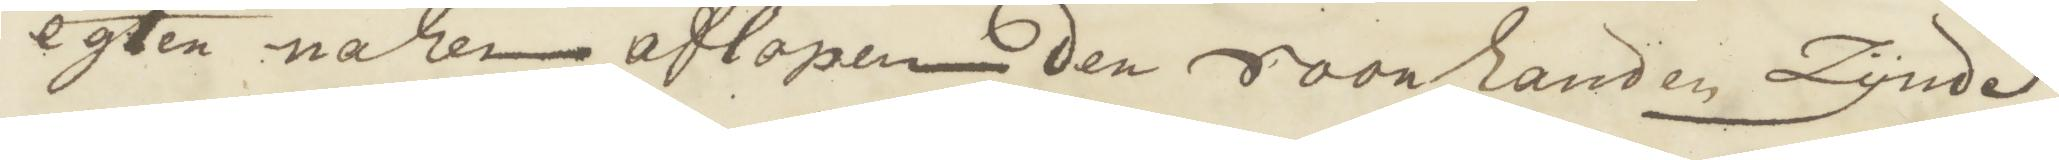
egter na het aflopen den voorhanden zijnde
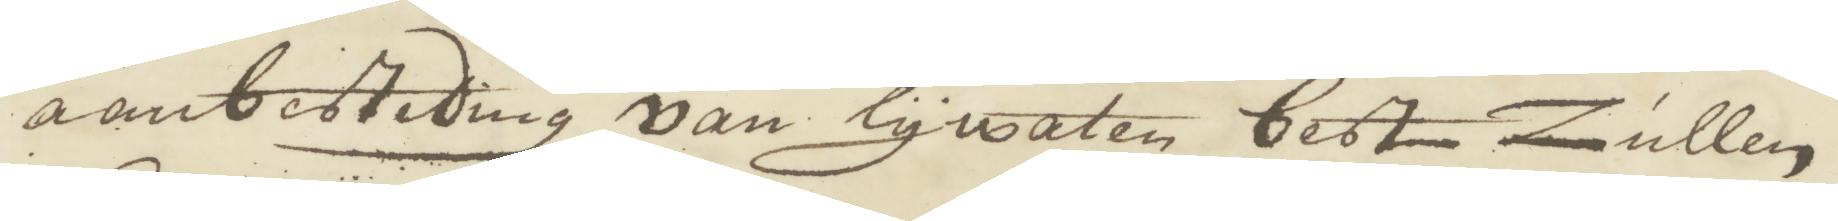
aanbesteding van lijwaten best zullen
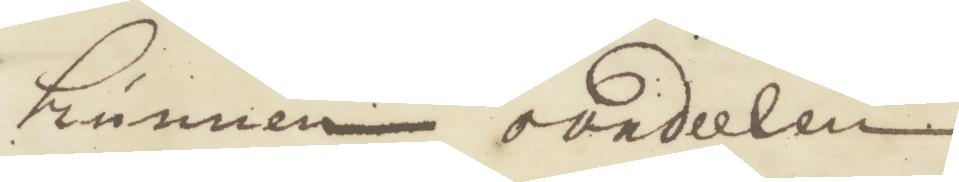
kunnen oordeelen
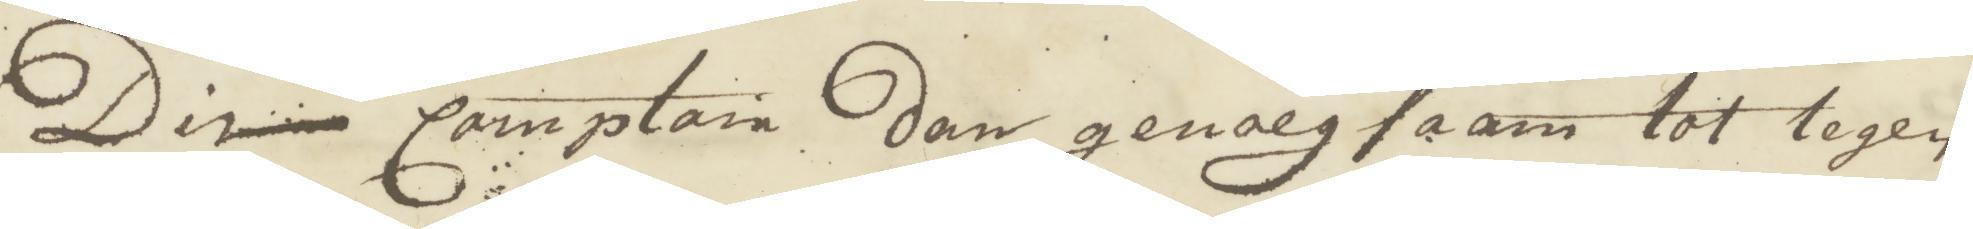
Dit Comptoir dan genoegsaam tot tegen
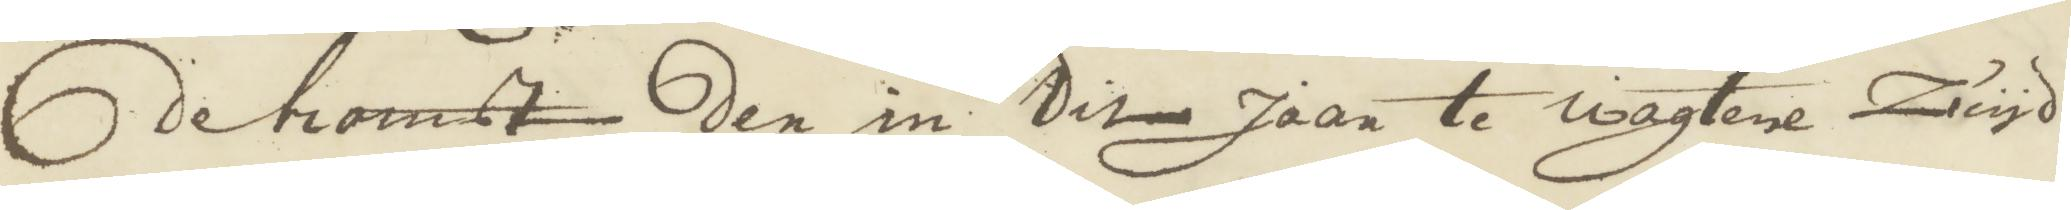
de komst den in dit jaar te wagtene Zuijd
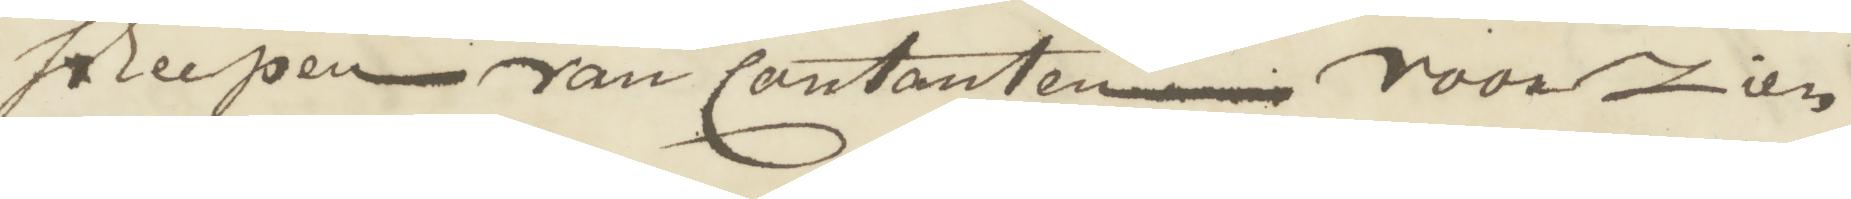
scheepen van Contanten voorzien
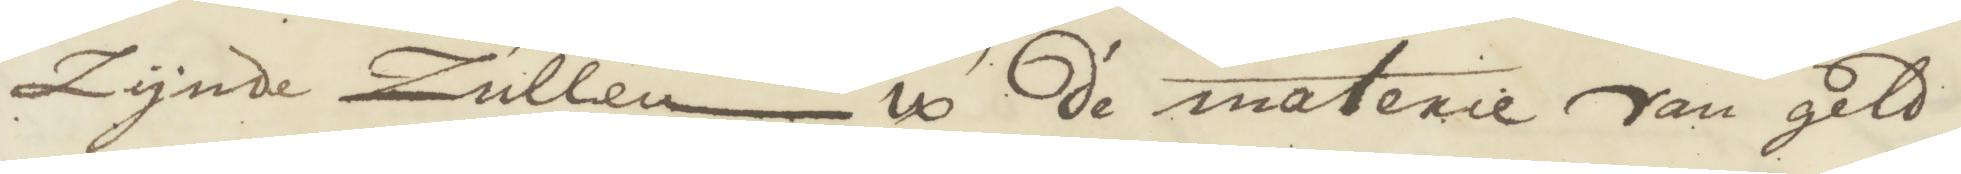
zijnde zullen w' de materie van geld
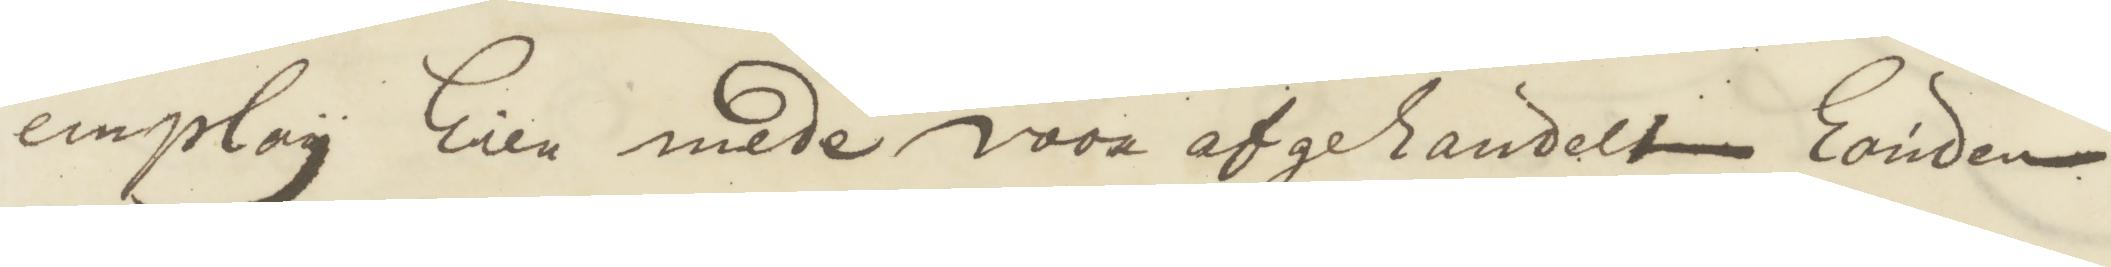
emploij hier mede voor afgehandelt houden
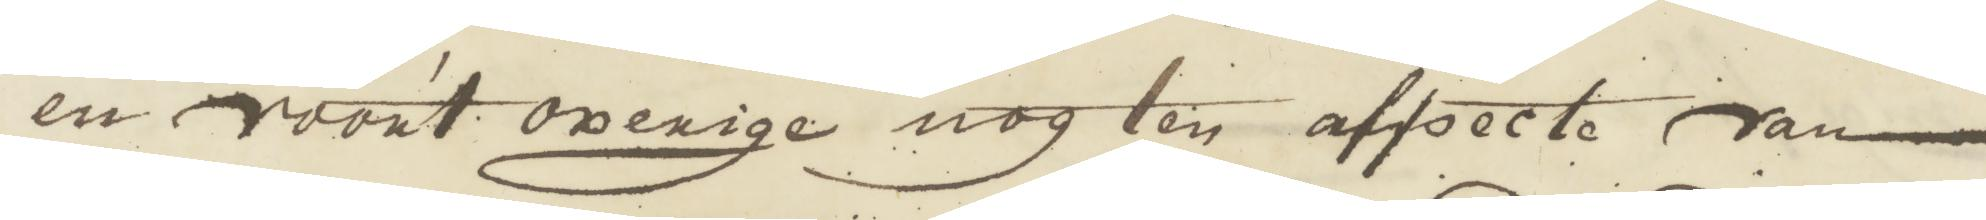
en voor't overige nog ten aspecte van
